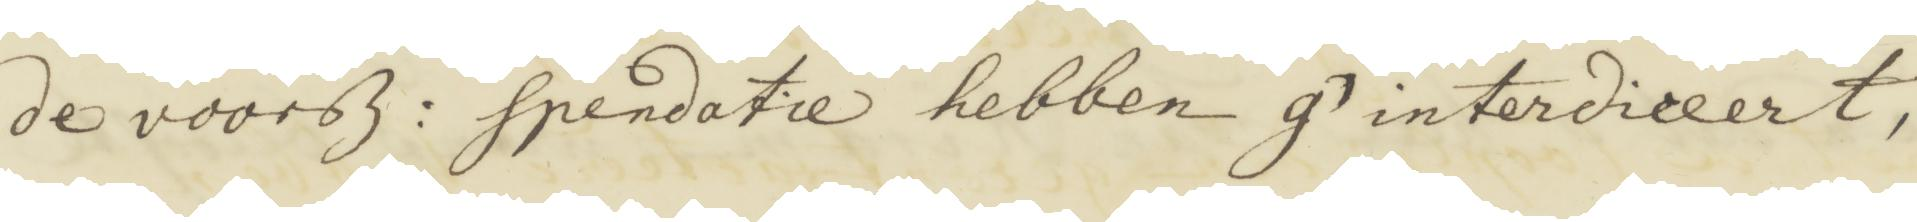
de voorsz: spendatie hebben g’interdiceert,
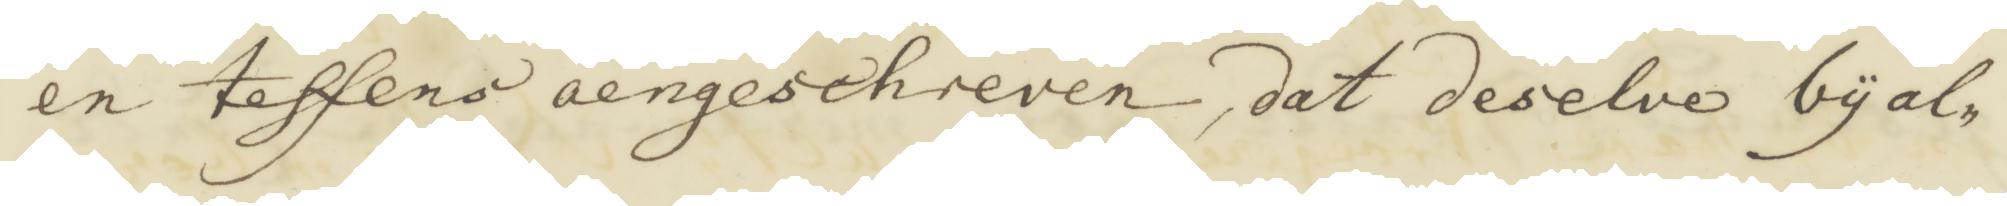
en teffens aengeschreven, dat deselve bij al„
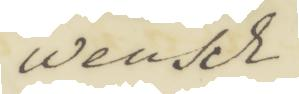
wensch
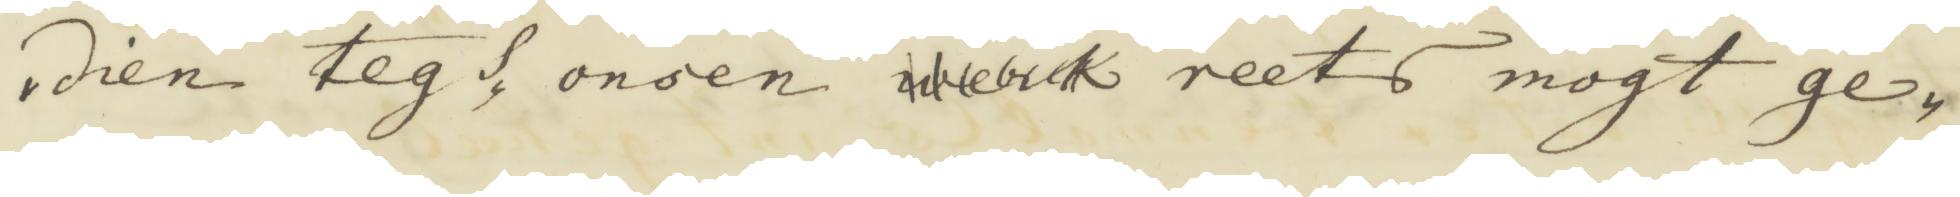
„dien teg„s onsen werck reets mogt ge„
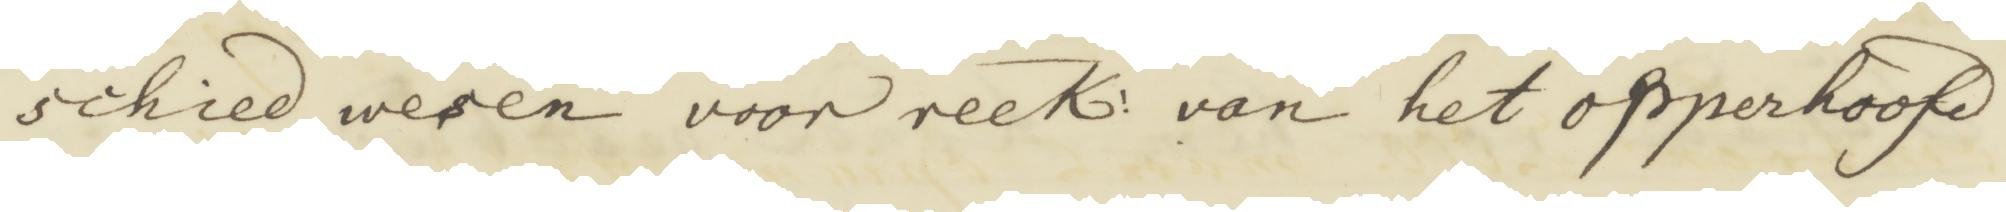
schied wesen voor reek: van het opperhoofd
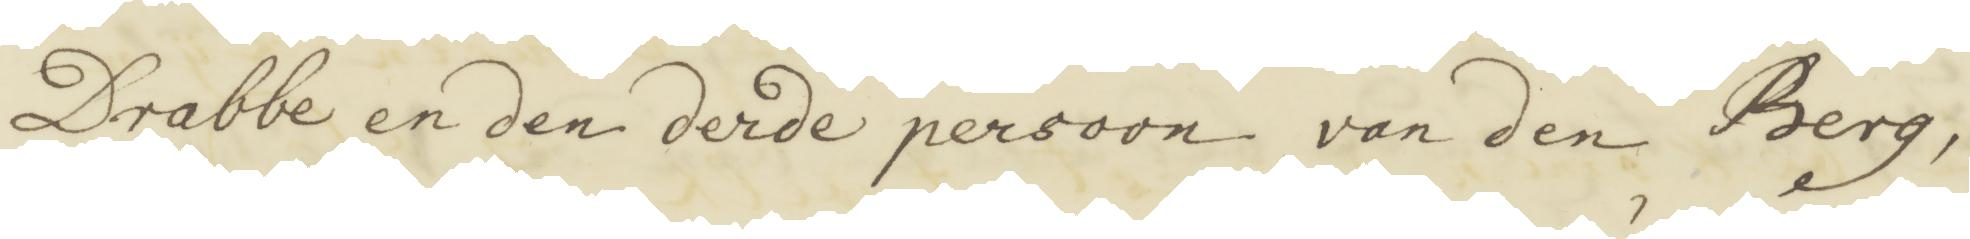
Drabbe en den derde persoon van den Berg,
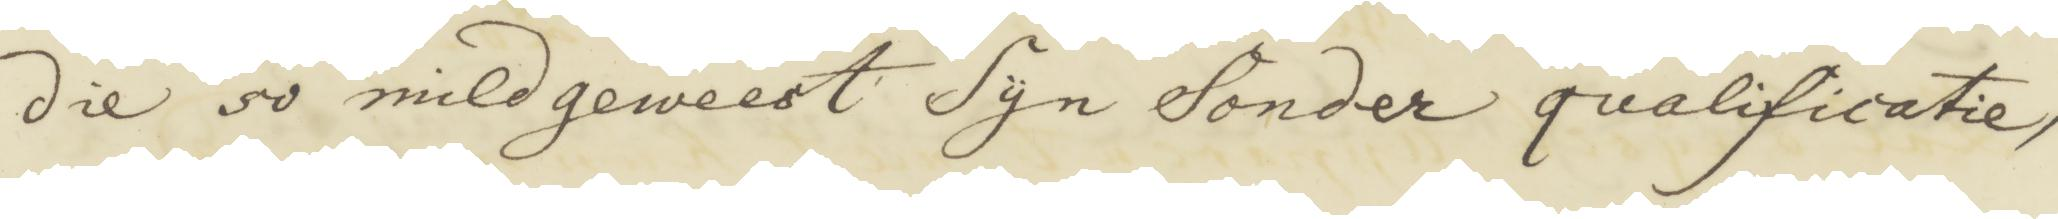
die so mild geweest sijn sonder qualificatie,
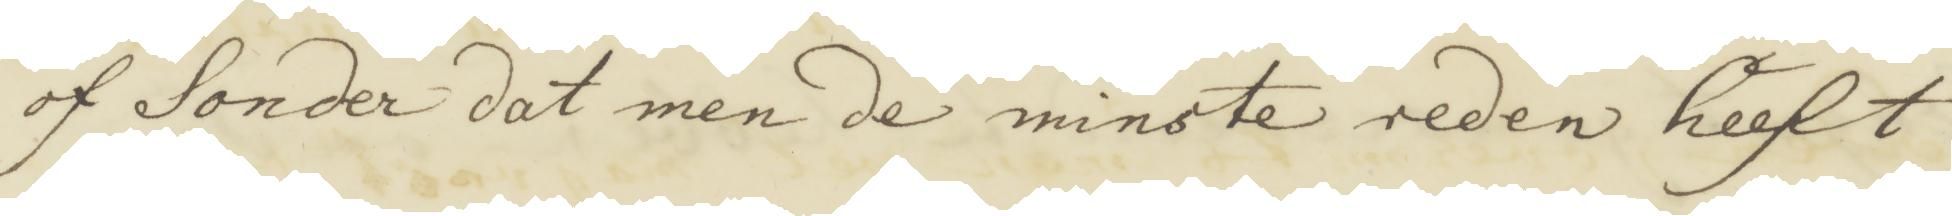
of sonder dat men de minste reden heeft
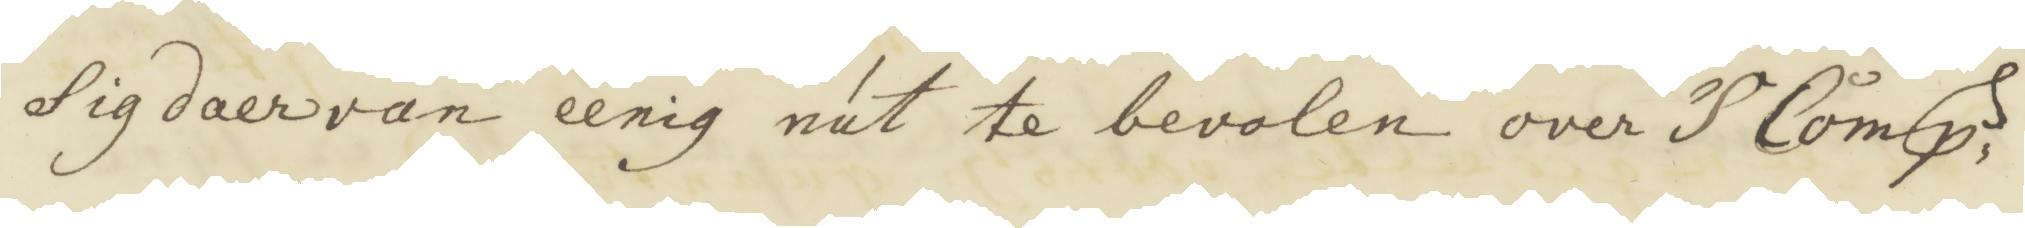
sig daer van eenig nut te bevolen over ’s Comp„s
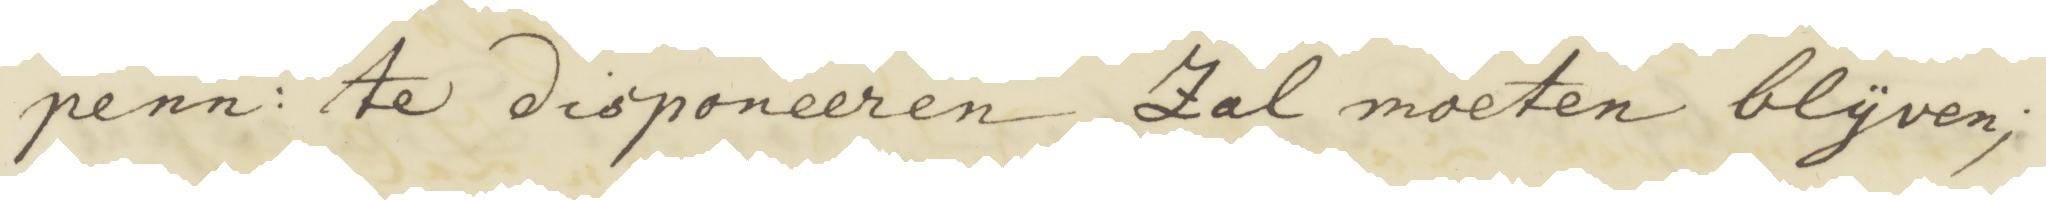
penn: te disponeeren zal moeten blijven;
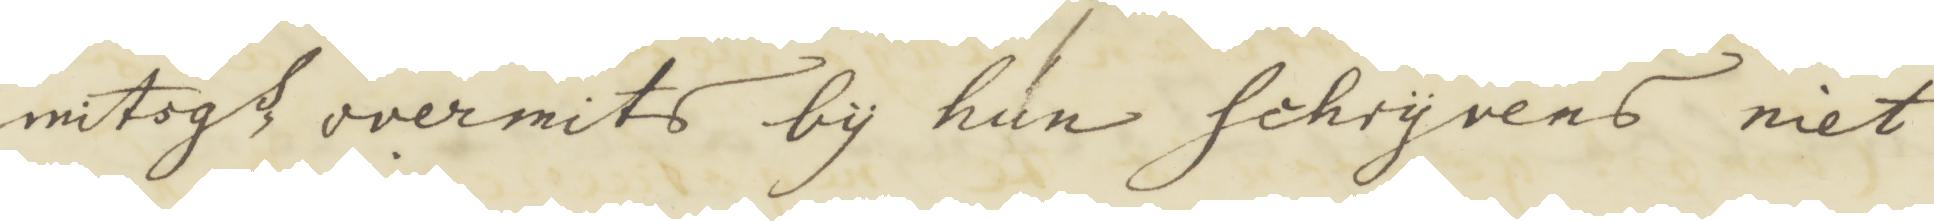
mitsg„s overmits bij hun schrijvens niet
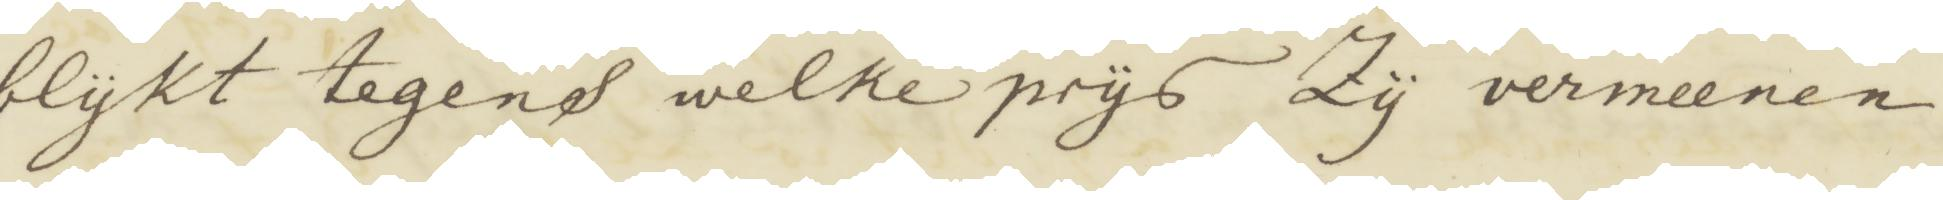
blijkt tegens welke prijs zij vermeenen
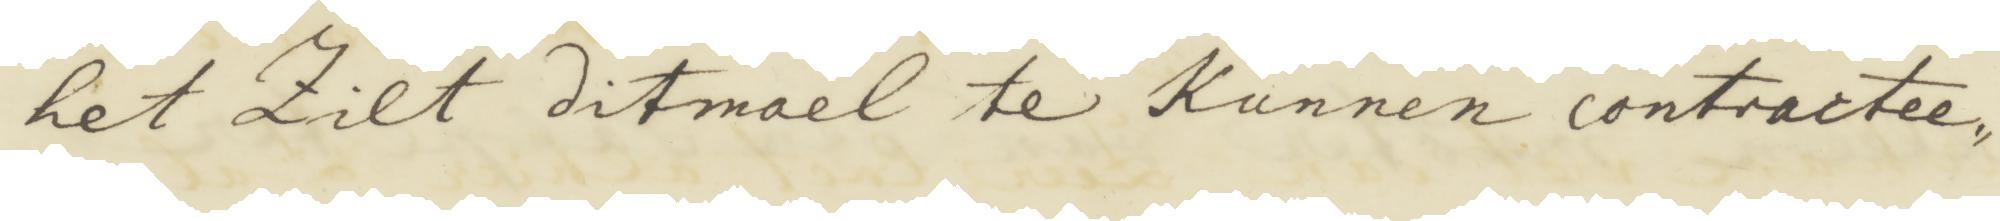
het zilt ditmael te kunnen contractee„
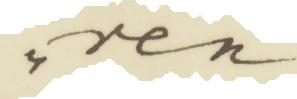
„ren
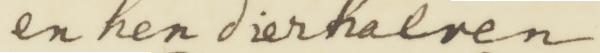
en hen dierhalven
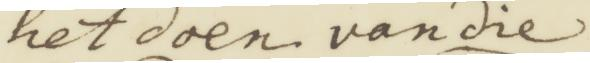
het doen van die
